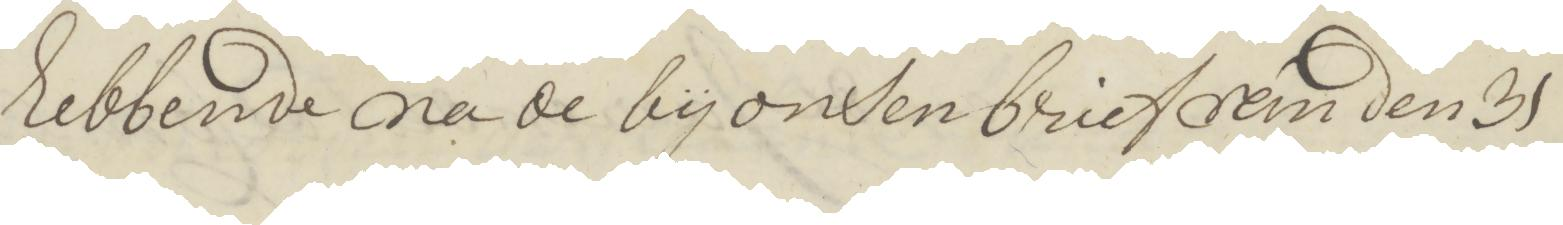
hebbende na de bij onsen brief van den 31
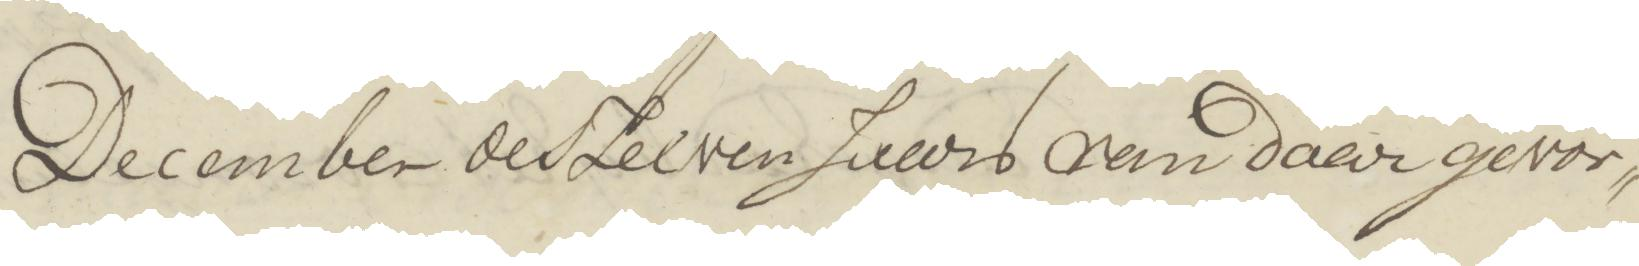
December deszelven Jaars van daar gevor„
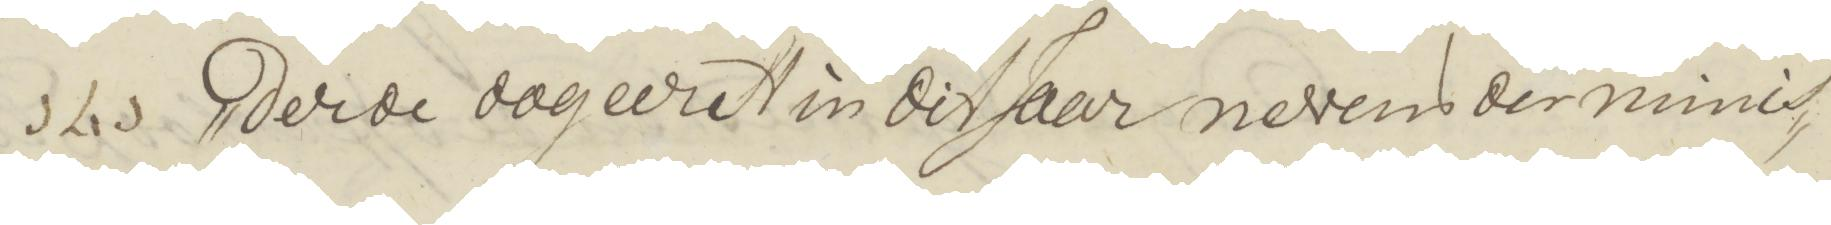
derde dog eerst in dit Jaar nevens der minis„
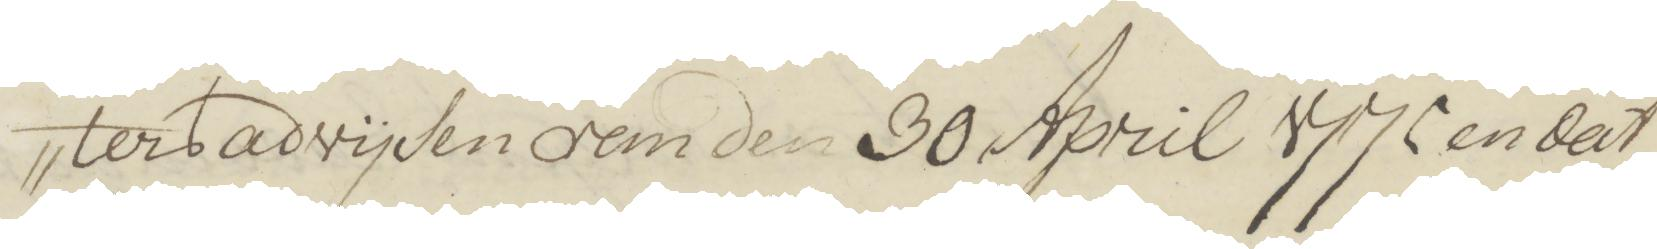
„ters advijsen van den 30. April 1775 en dat
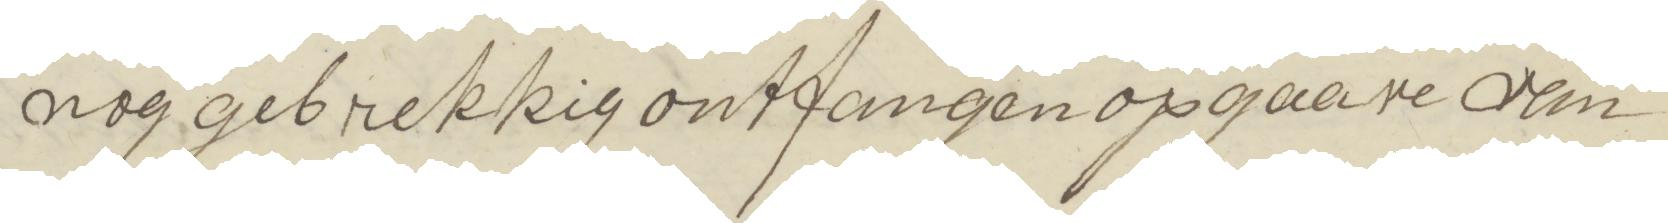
nog gebrekkig ontfangen opgaave van
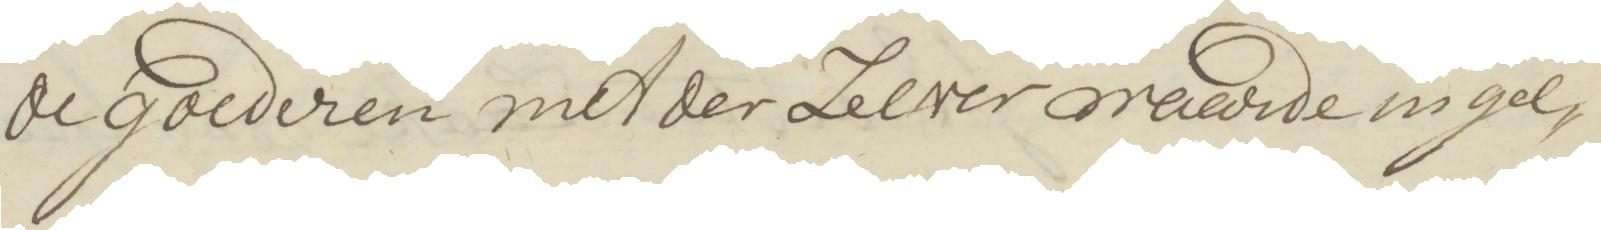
de goederen met der Zelver waarde in gel„
